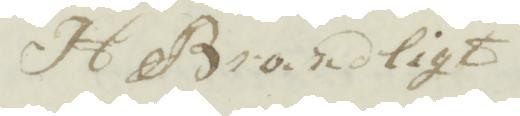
H Brandligt
